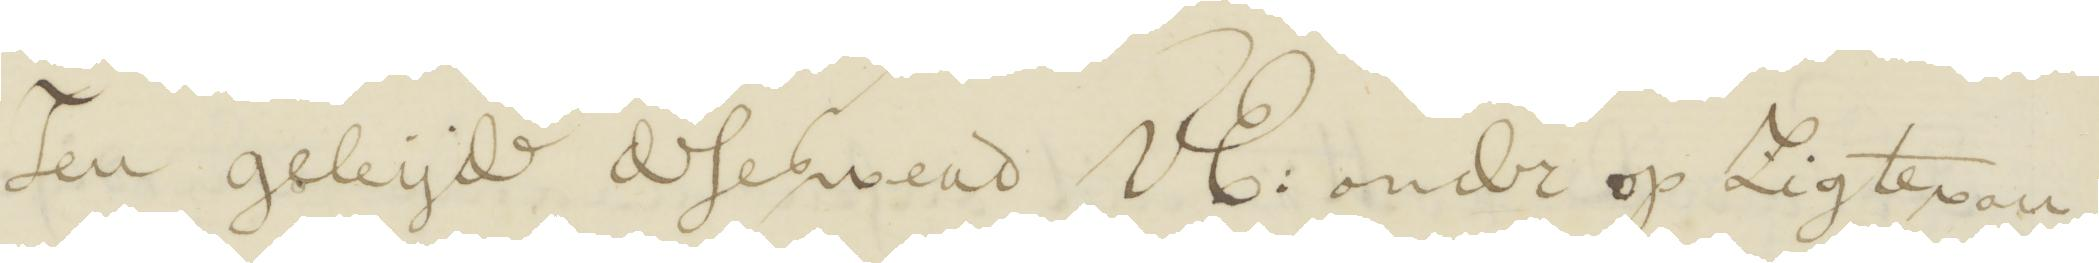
Ten geleijde deses werd VE: onder op zigte van
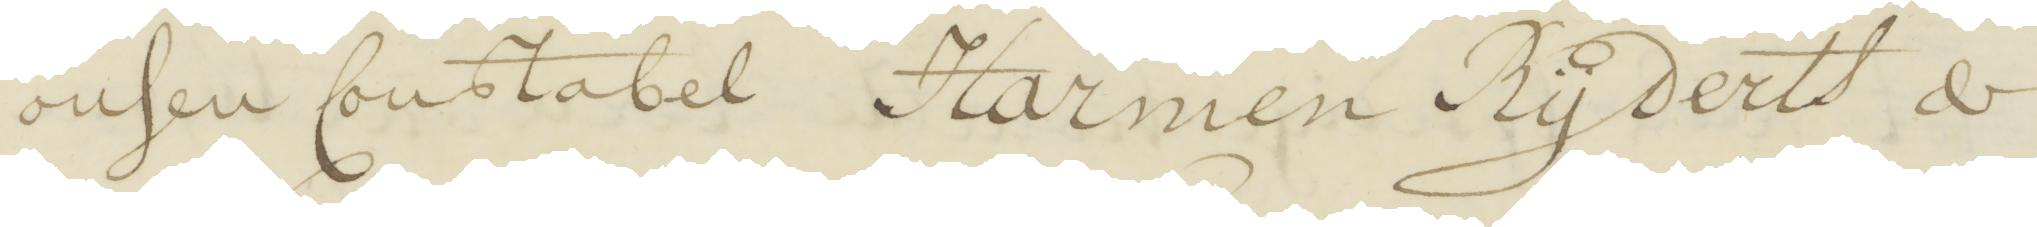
onsen Constabel Harmen Rijderts de
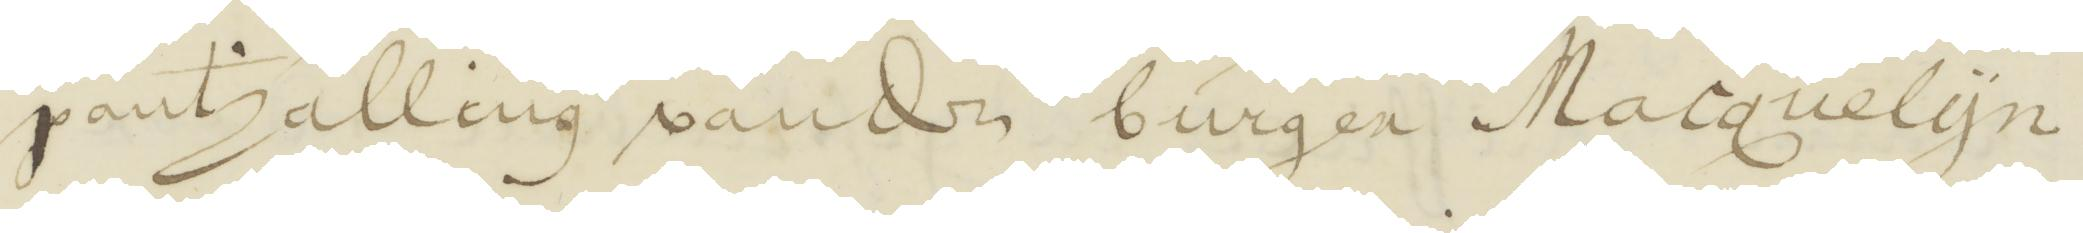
pantjalling van den burger Macquelijn
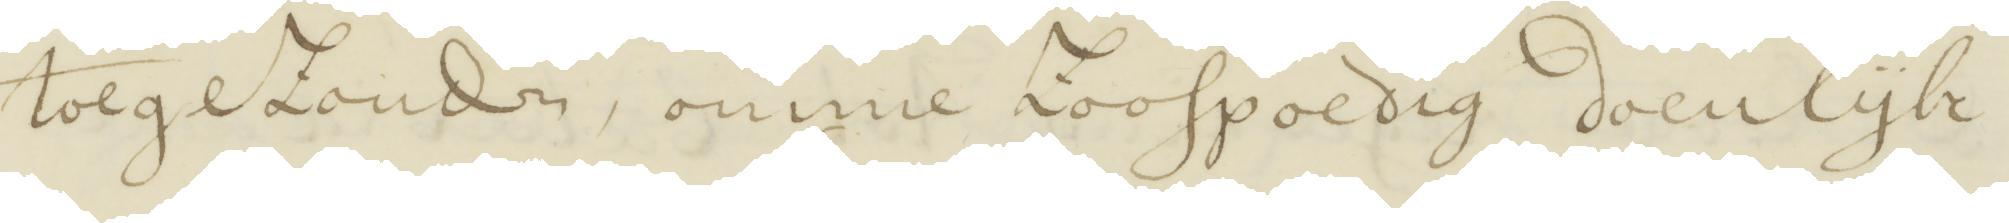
toe gezonden, omme zoo spoedig doenlijk
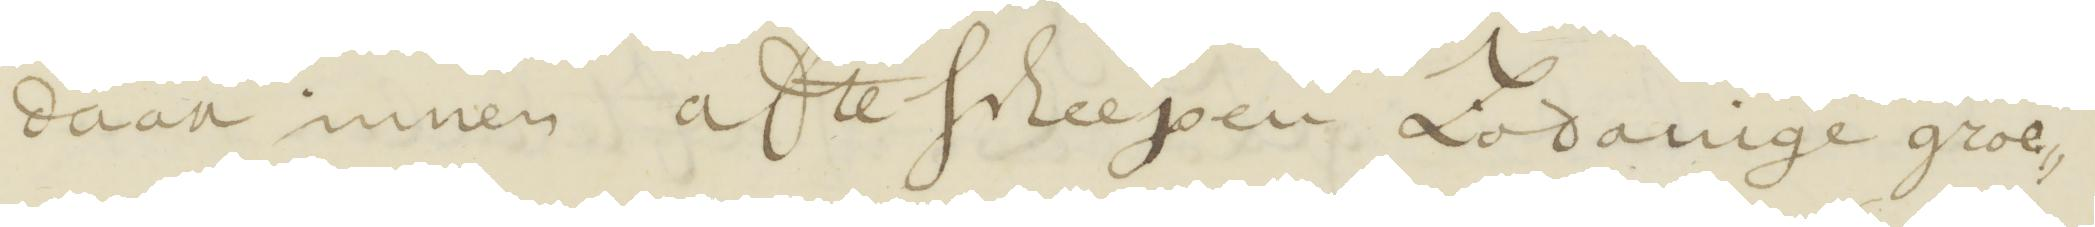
daar innen afte scheepen zodanige groe„
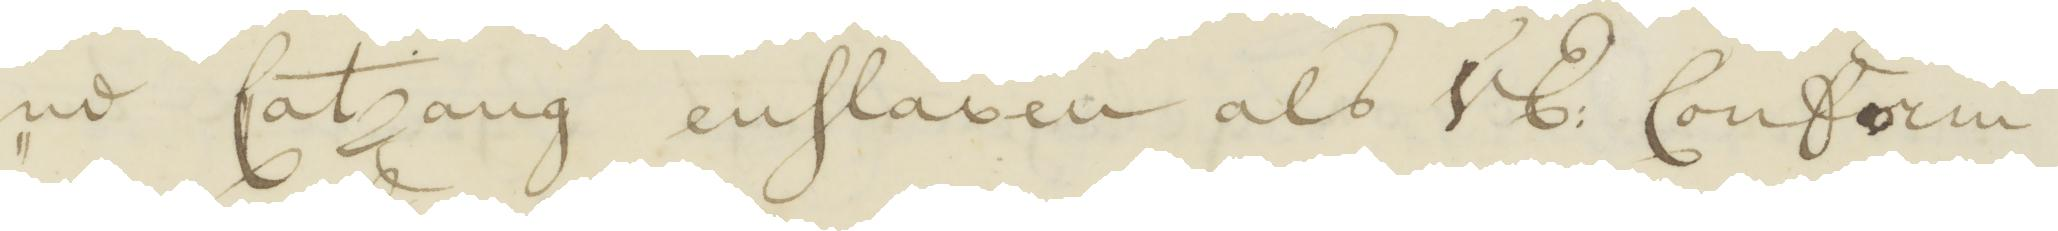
„ne Catjang en slaven als VE: Conform
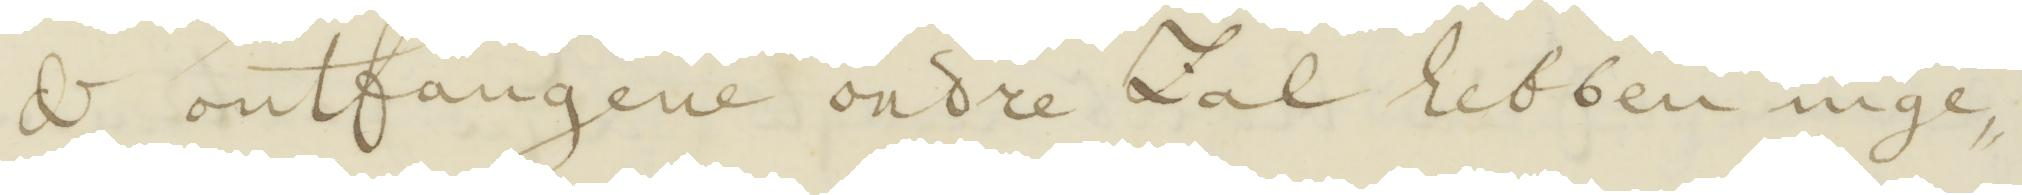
de ontfangene ordre zal hebben inge„
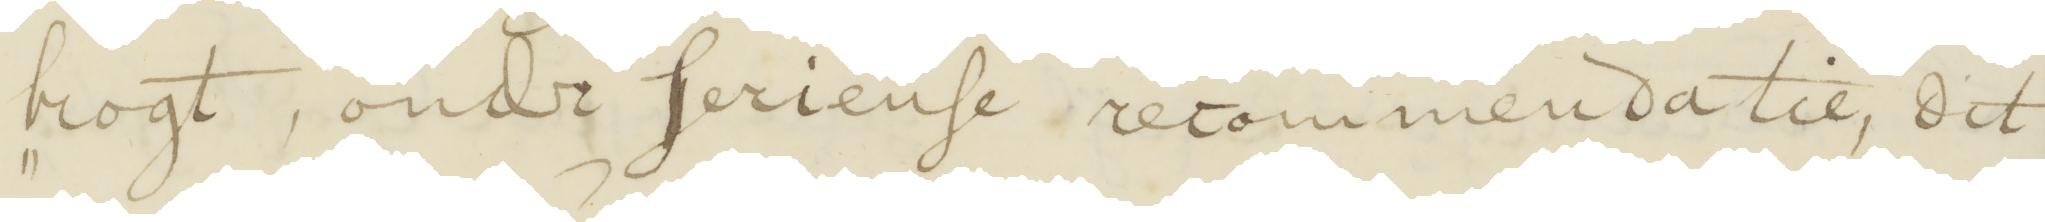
„kogt, onder serieuse recommendatie, dit
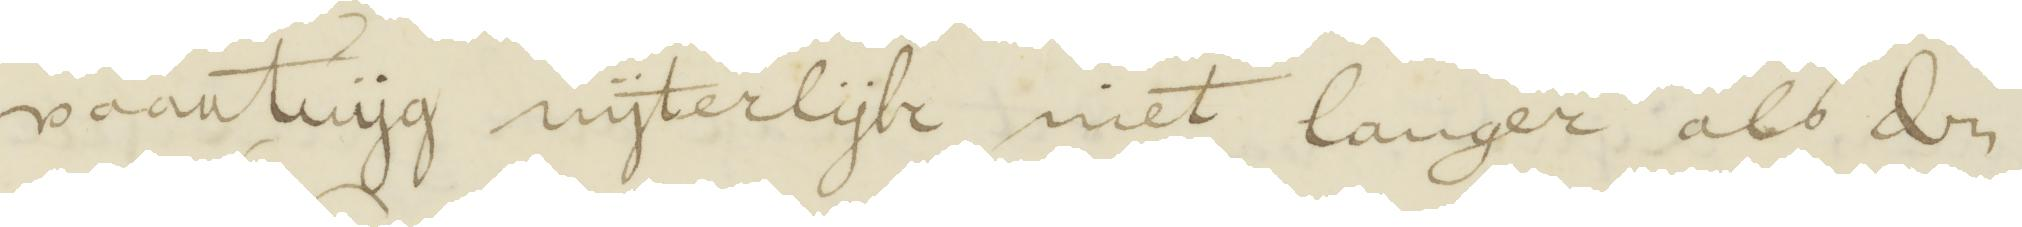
vaartuijg uijterlijk niet langer als den
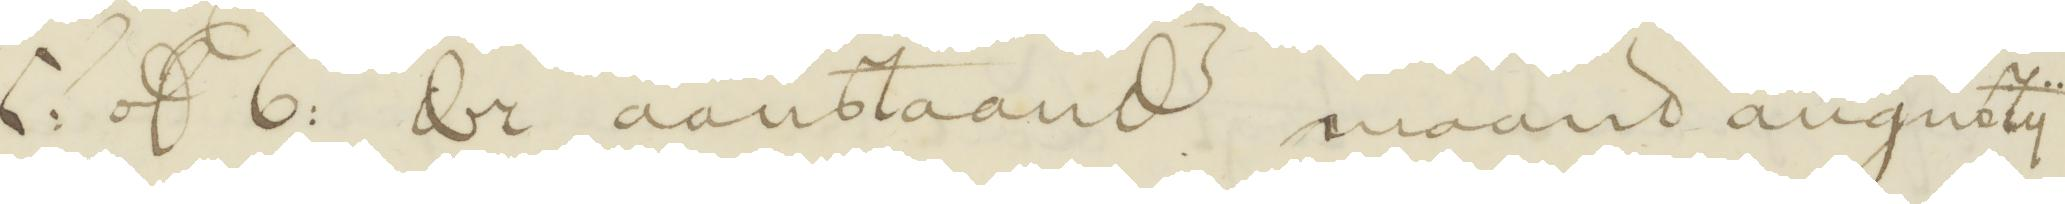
5:' of 6: der aanstaande maand augustij
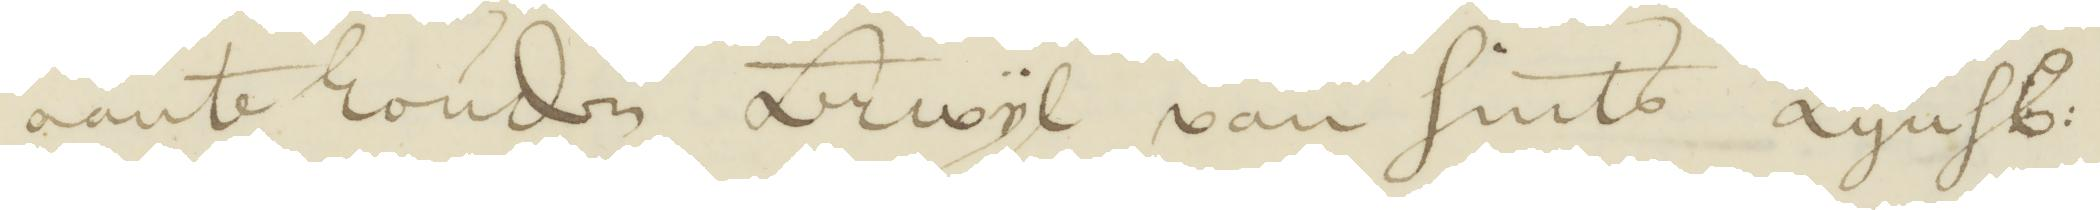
aante houden terwijl van sints zijn 's E:
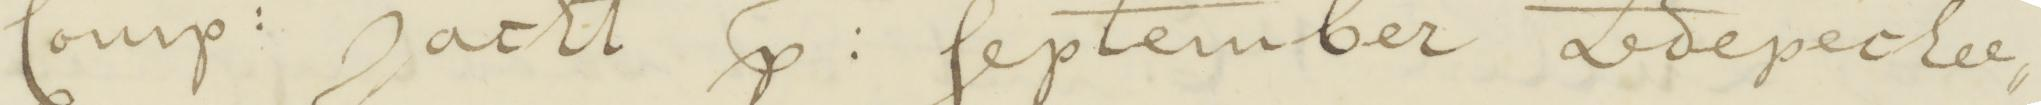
Comp:s jacht p:mo september te depechee„
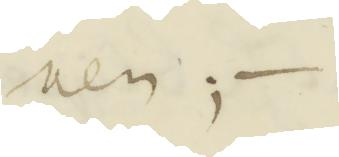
ren; —
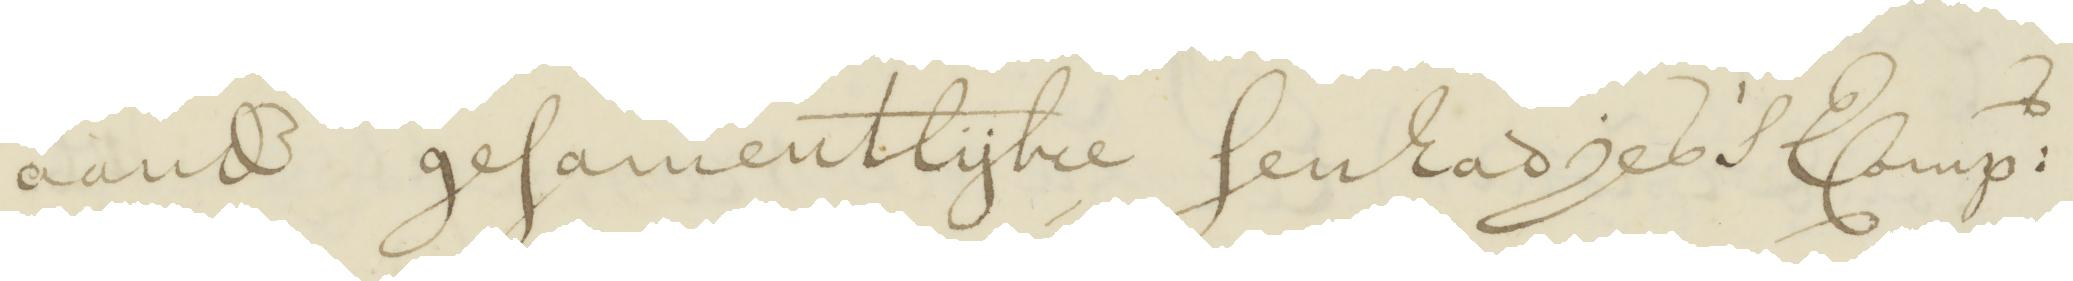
aande gesamentlijke senhadjes 's EComp:s
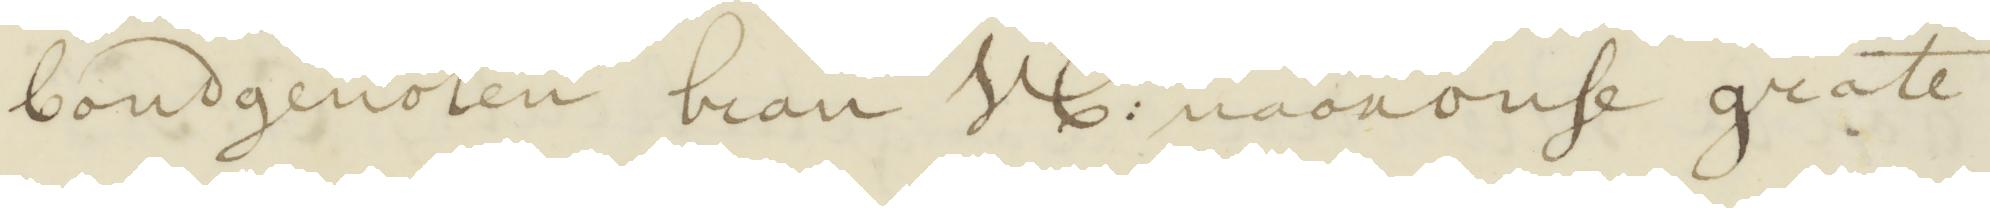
bondgenoten kan VE: naar onse grote
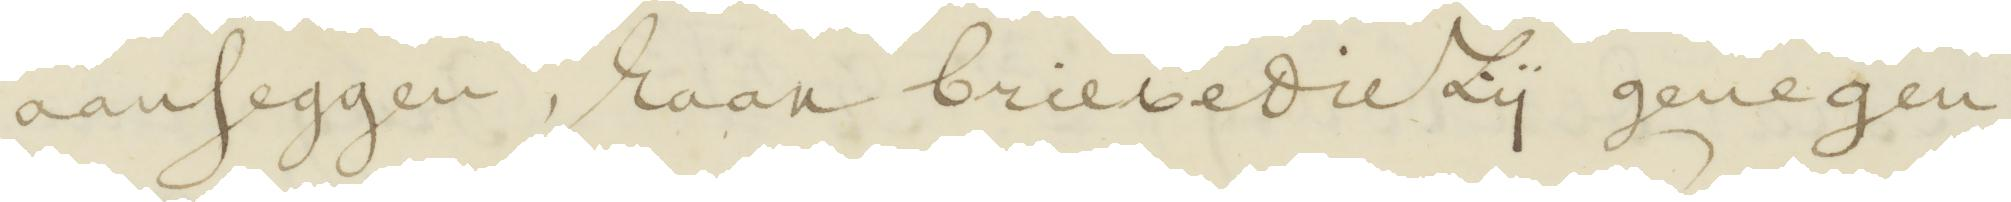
aanseggen, haar brieve die zij genegen
